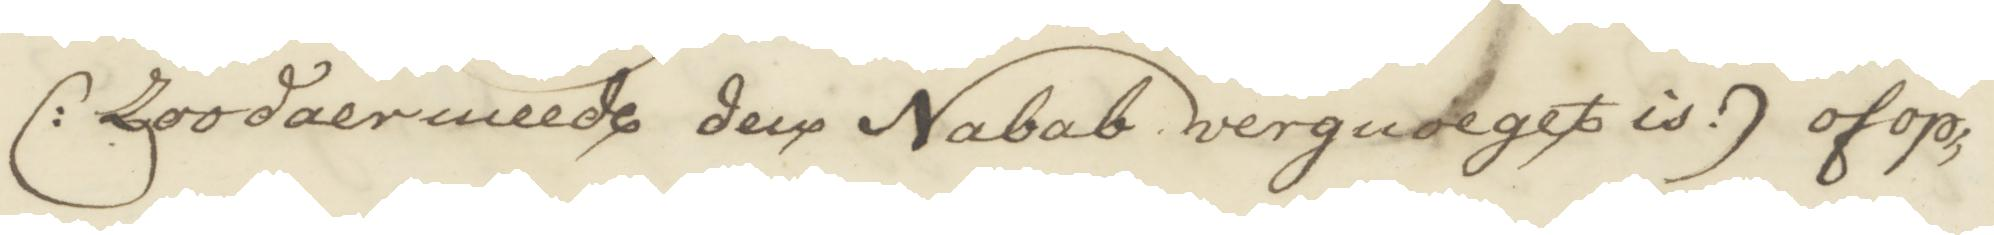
(:zoo daer meede den Nabab vergnoeget is:) of op„
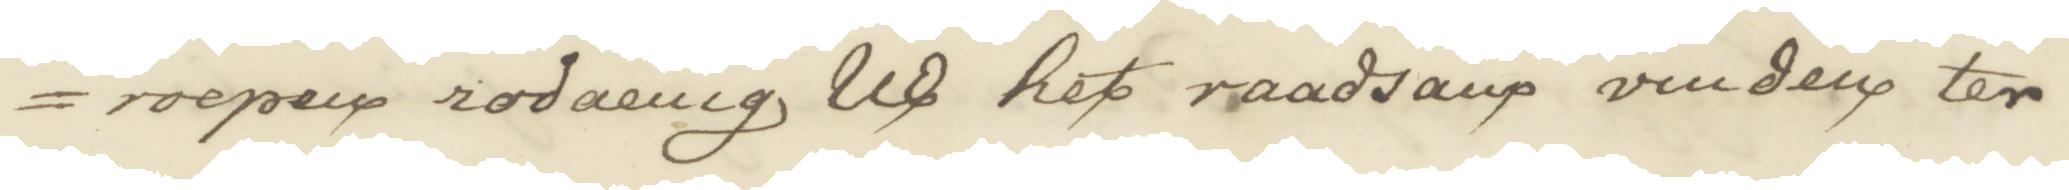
=roepen zodaenig UE het raadsam vinden ter
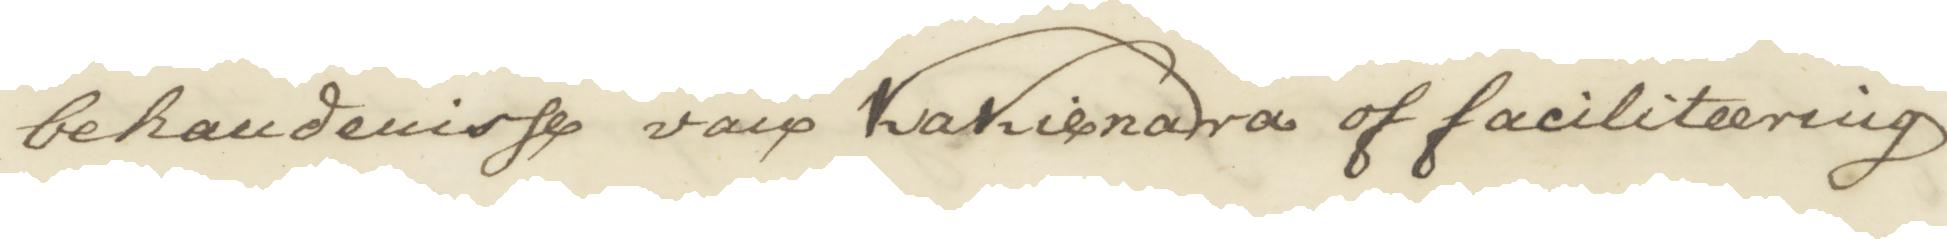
behaudenisse van Kakienara of faciliteering
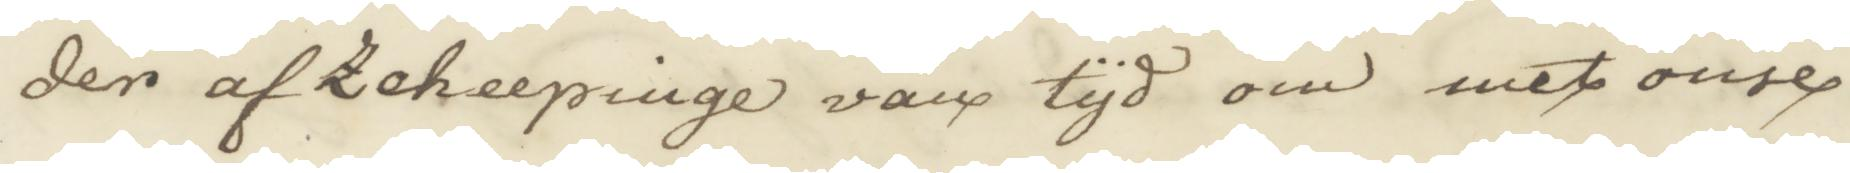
der af zcheepinge van tijd om met onse
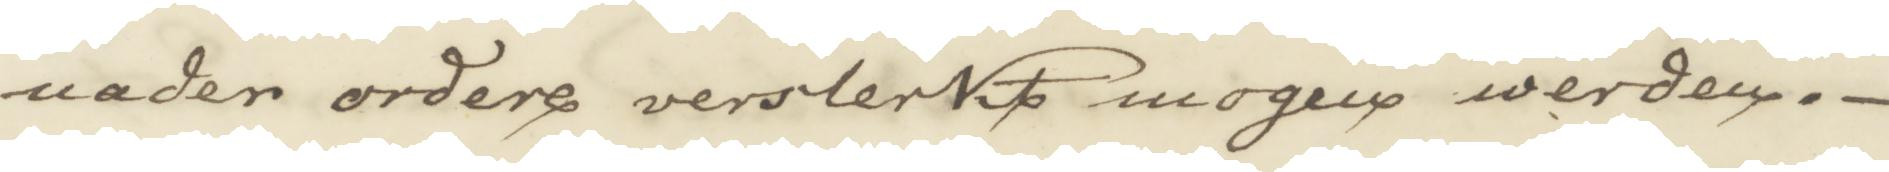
nader ordere versterkt mogen werden. —
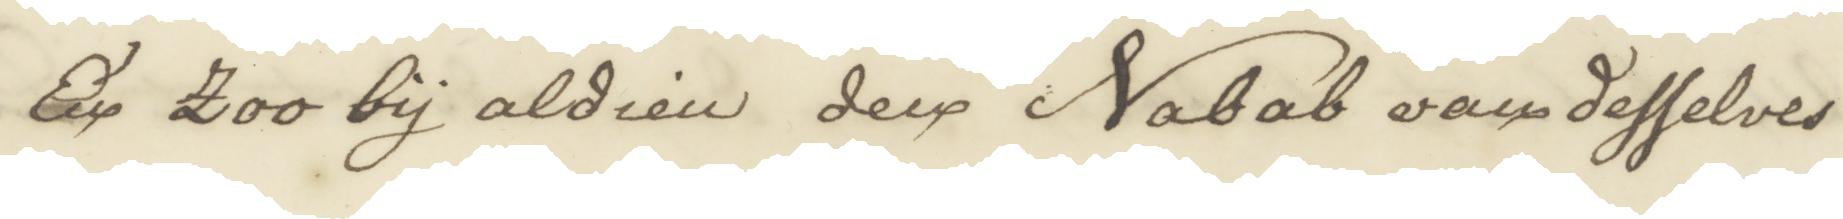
En zoo bij aldien den Nabab van desselves
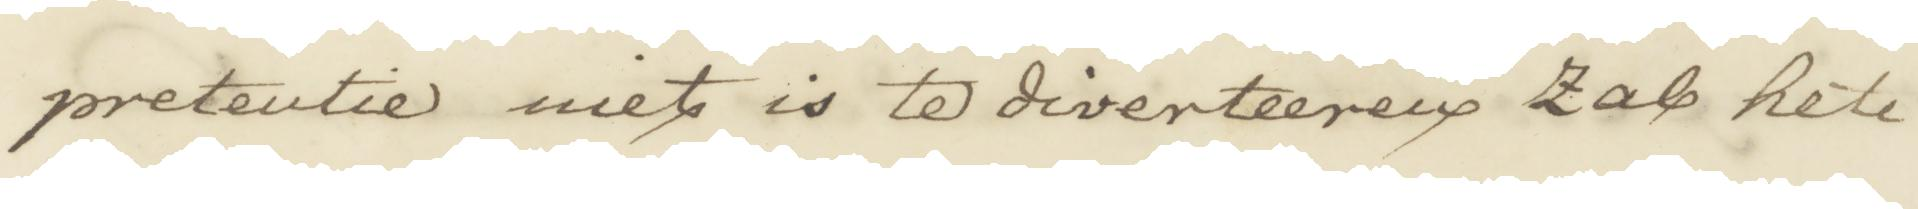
pretentie niet is te diverteeren zal het
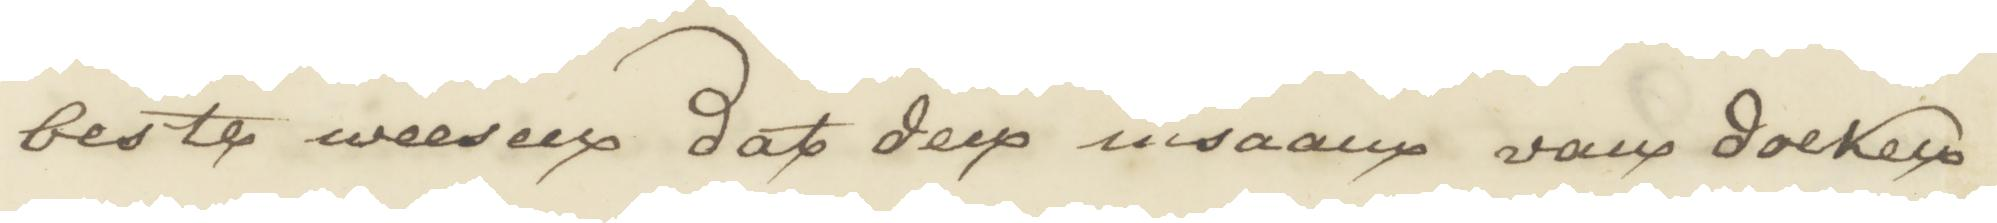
beste weesen dat den insaam van doeken
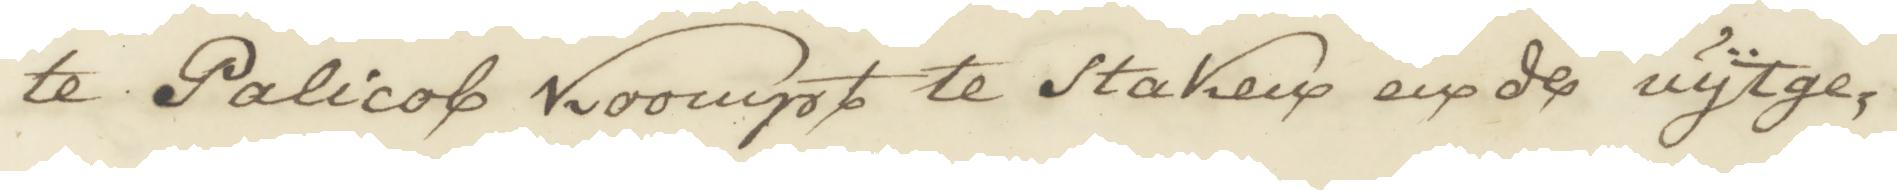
te Palicol koompt te staken en de uijtge„
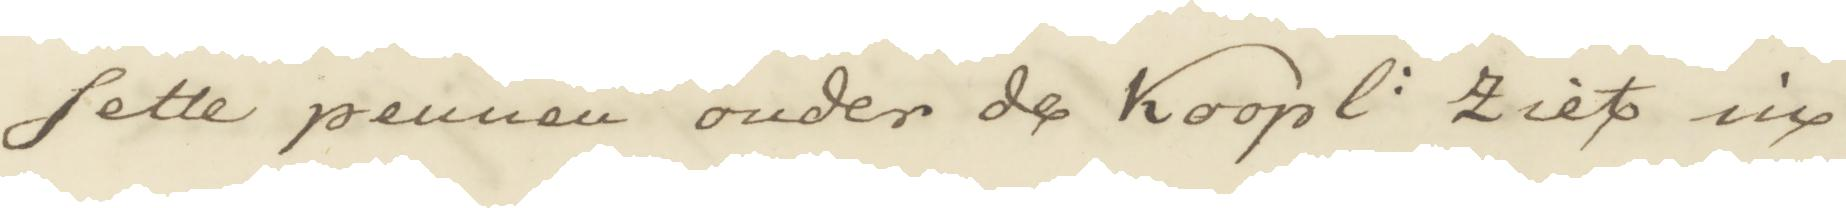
sette pennen onder de koopl: ziet in
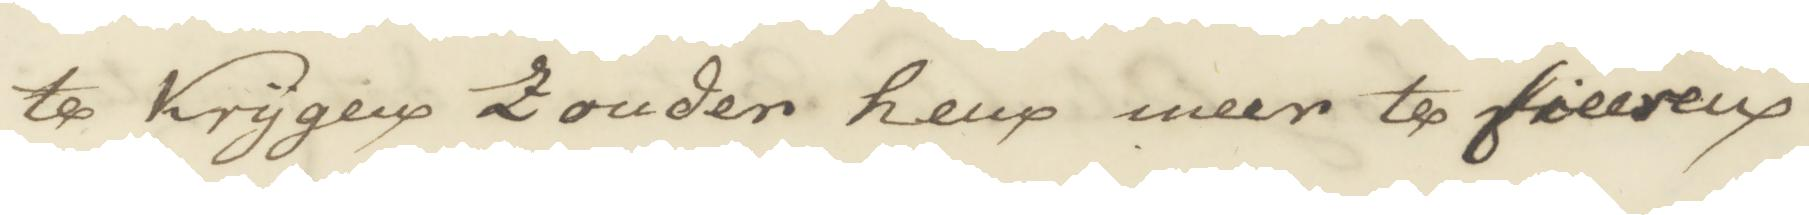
te krijgen zonder hem meer te freesen
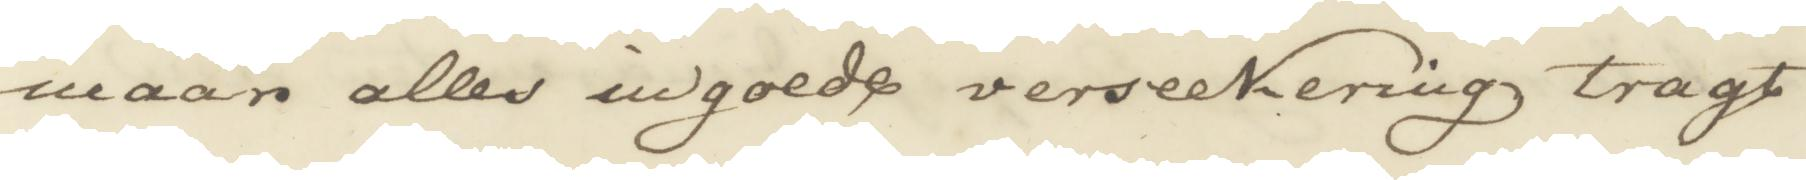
maar alles ingoede verseekering tragt
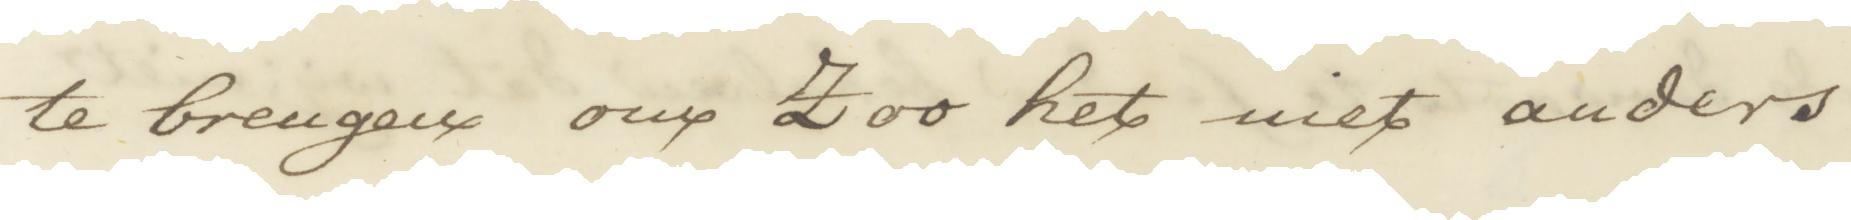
te brengen om zoo het niet anders
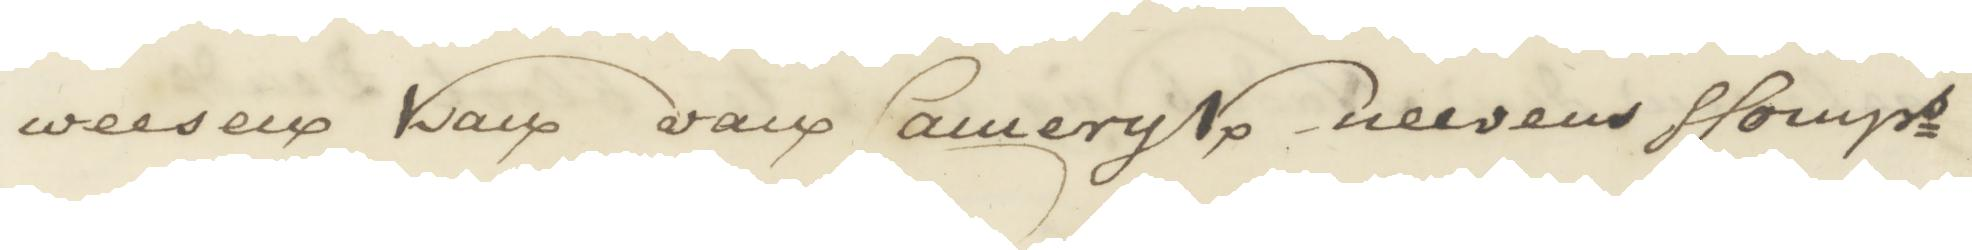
weesen kan van Cameryk neevens sComp=s
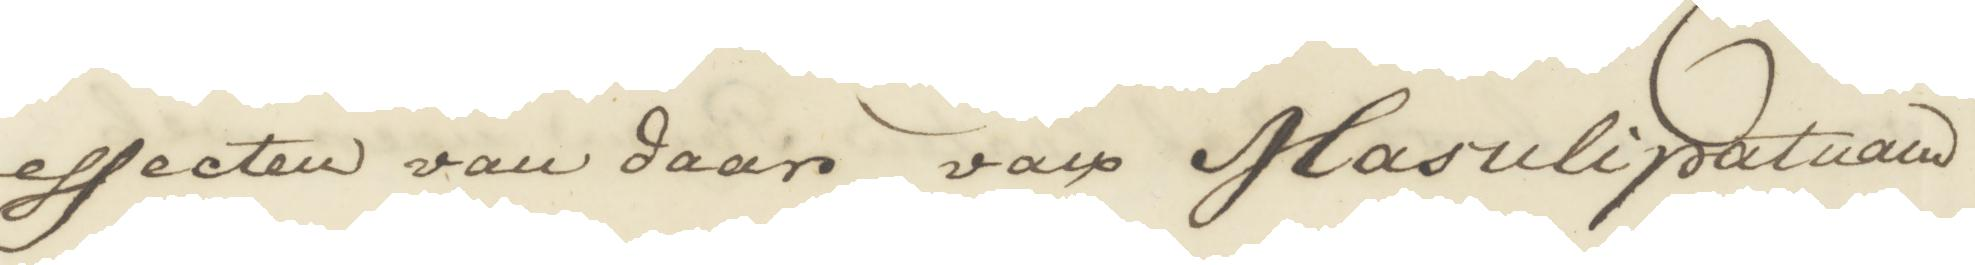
effecten van daar van Masulipatnam
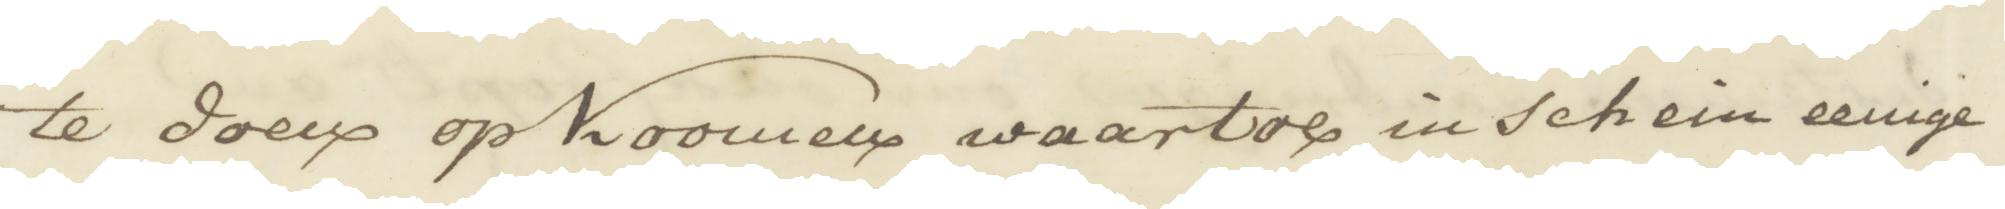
te doen opkoomen waartoe in schein eenige
